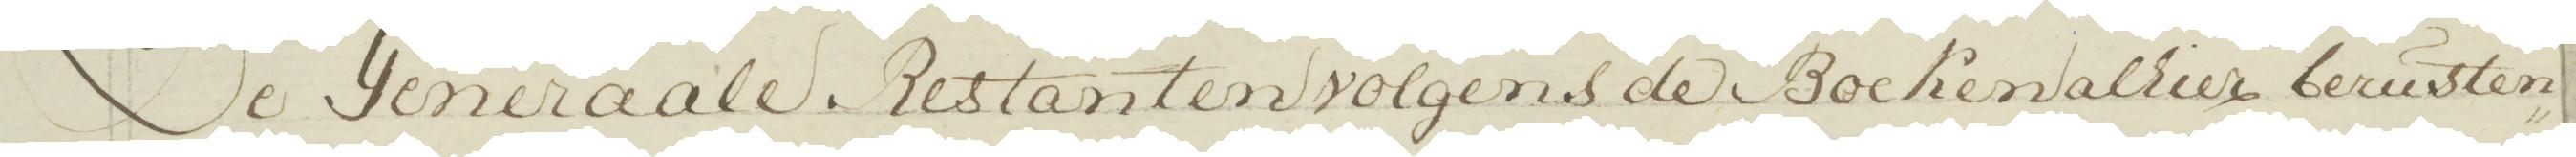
De Generaale Restanten volgens de Boeken alhier berusten„
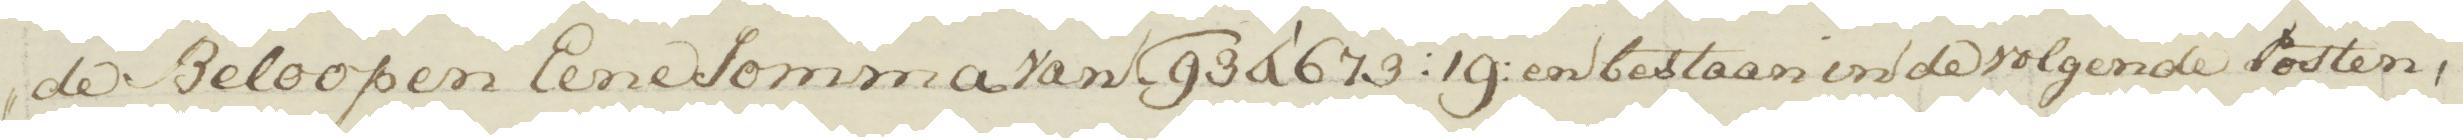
„de Beloopen Eene Somma van ƒ934'673:19: en bestaan in de volgende Posten,
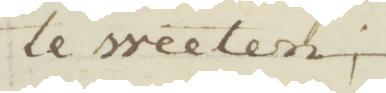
te weeten;
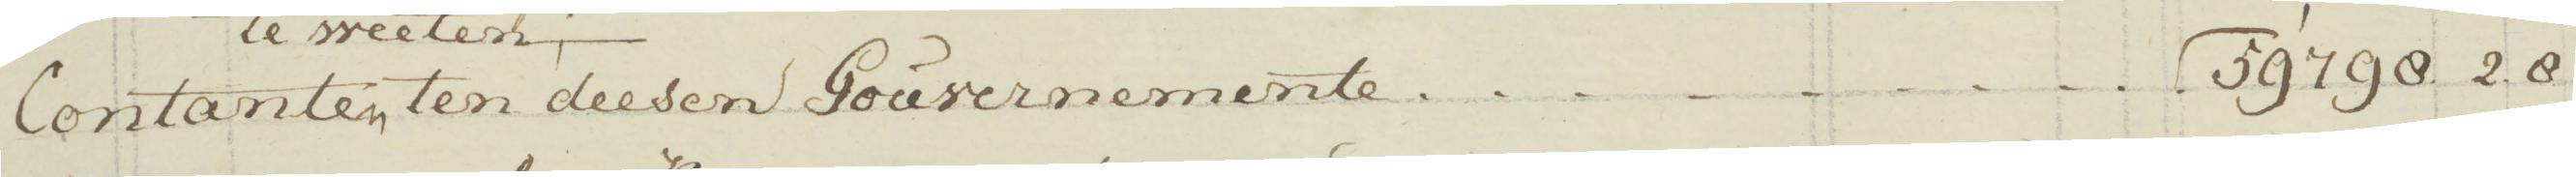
Contanten ten deesen Gouvernemente - - - - - - - - - ƒ 59'798. 2.8
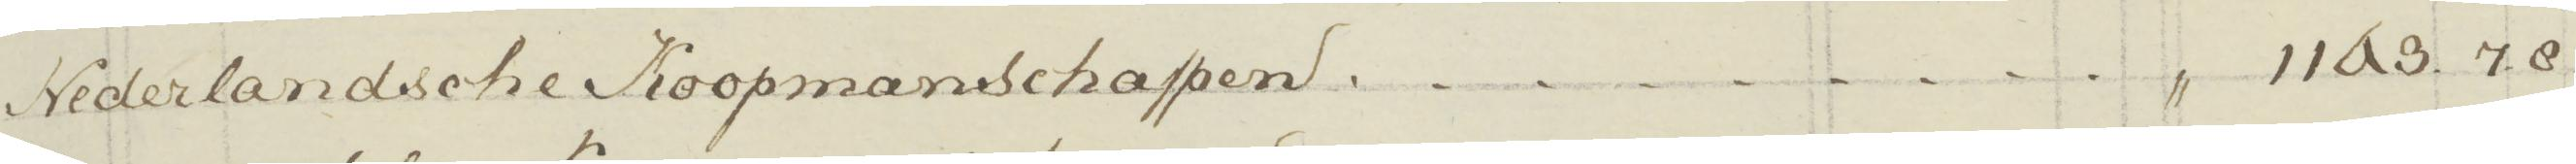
Nederlandsche Koopmanschappen - - - - - - - - - „ 1143. 7.8
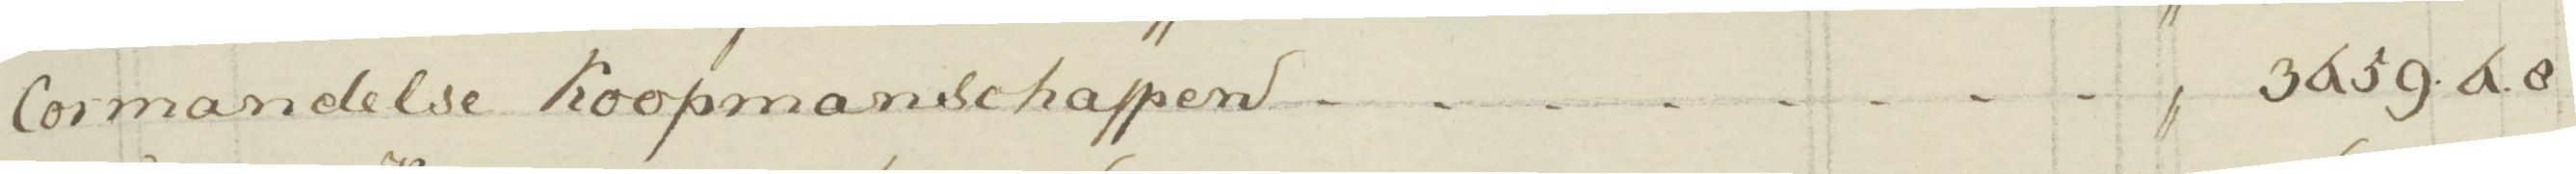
Cormandelse Koopmanschappen - - - - - - - - „ 3459. 4.8
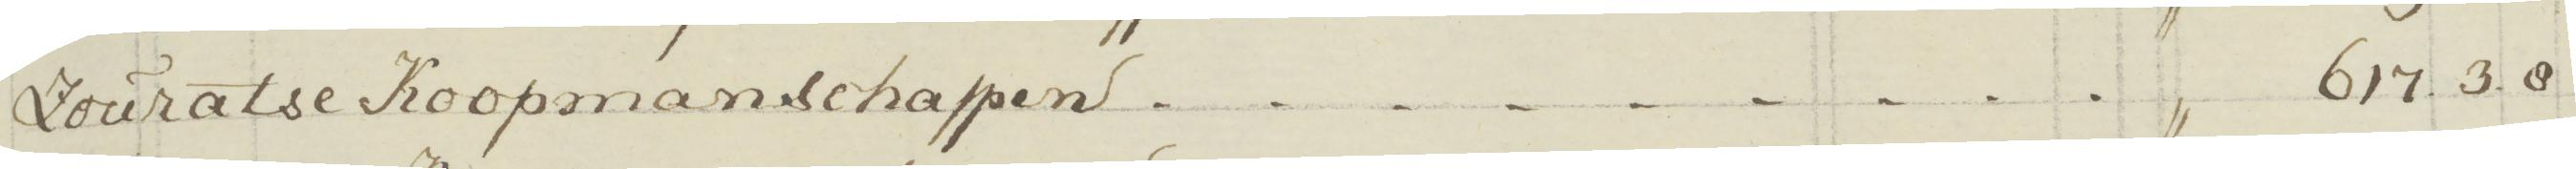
Zouratse Koopmanschappen - - - - - - - - - „ 617. 3.8
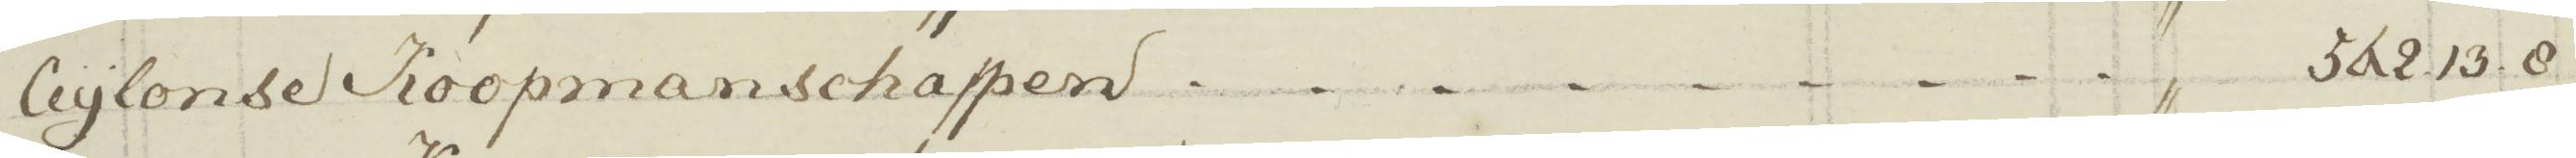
Ceijlonse Koopmanschappen - - - - - - - - - „542.13.8
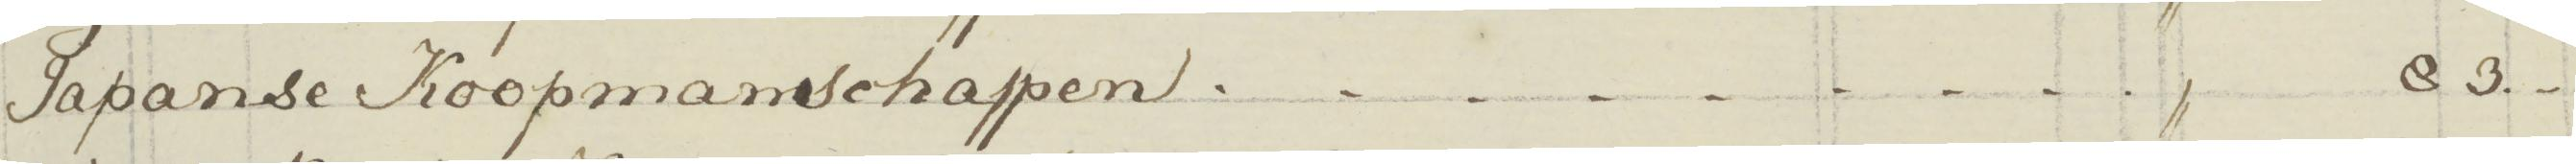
Japanse Koopmanschappen - - - - - - - - - „8. 3.—
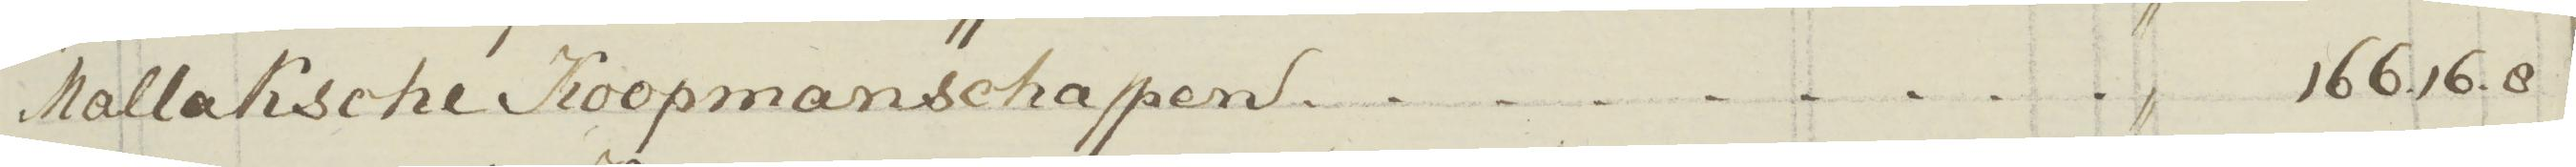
MallaKsche Koopmanschappen - - - - - - - - - „166.16.8
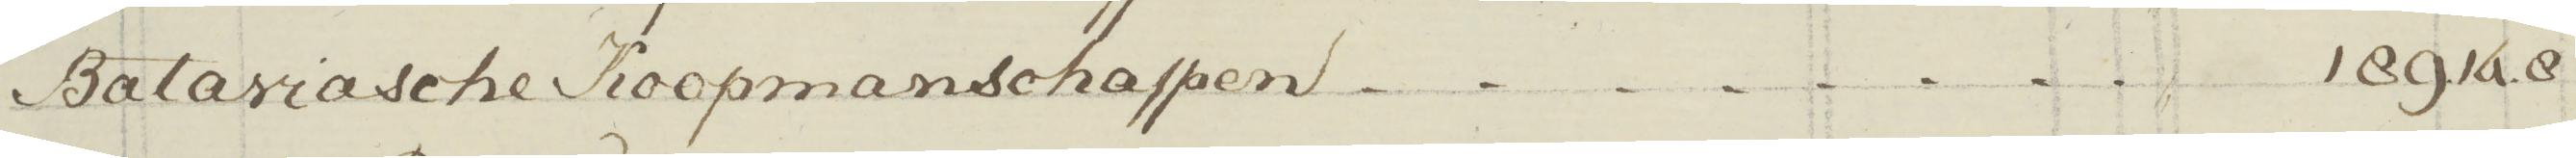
Bataviasche Koopmanschappen - - - - - - - - „189.14.8
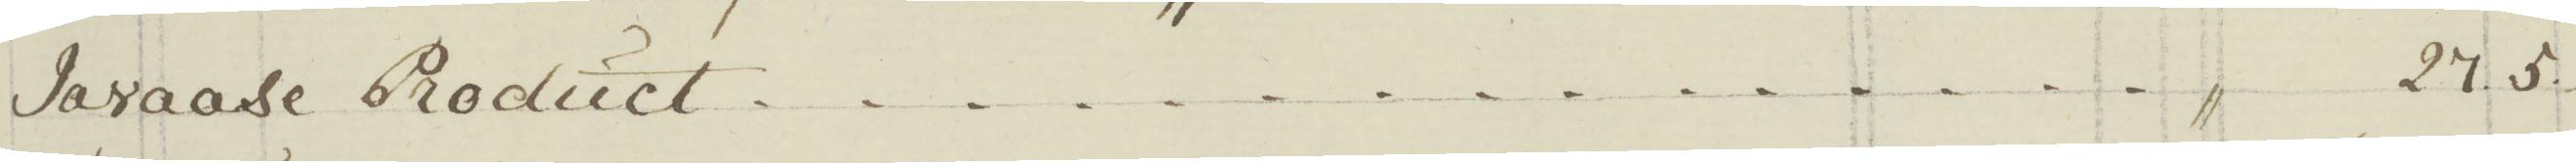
Javaase Product - - - - - - - - - - - - - - - „ 27. 5.—
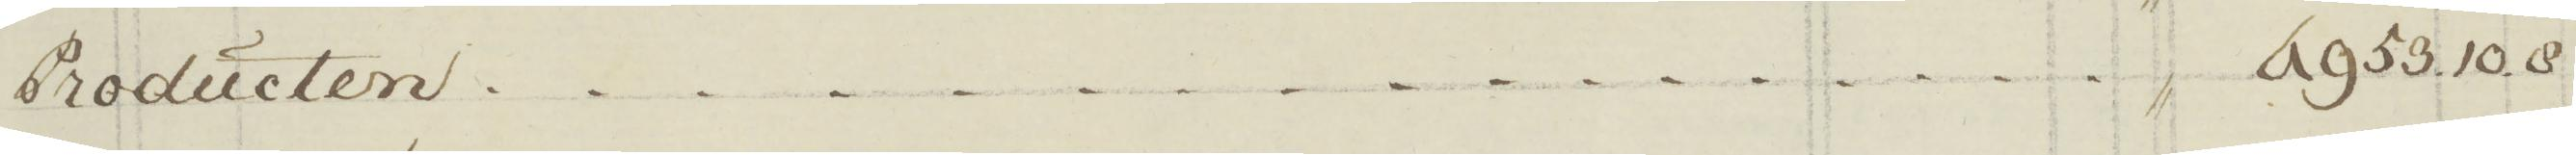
Producten - - - - - - - - - - - - - - - - - „4953.10.8
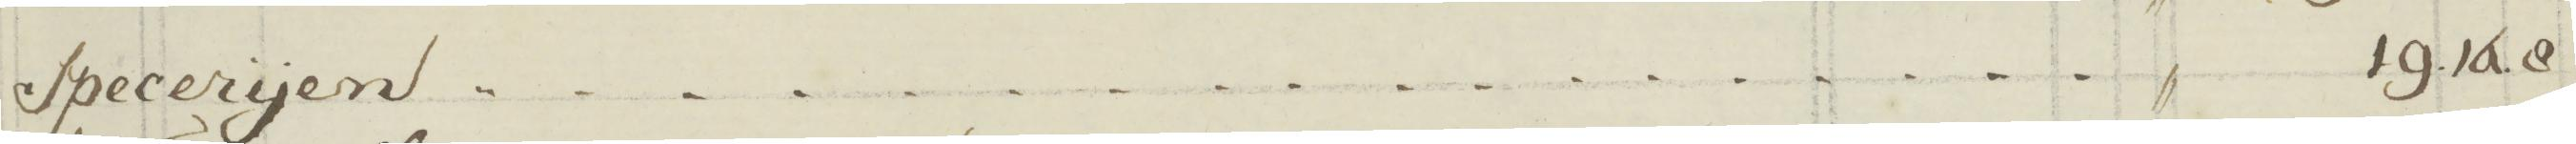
Specerijen - - - - - - - - - - - - - - - - - - „ 19.14.8
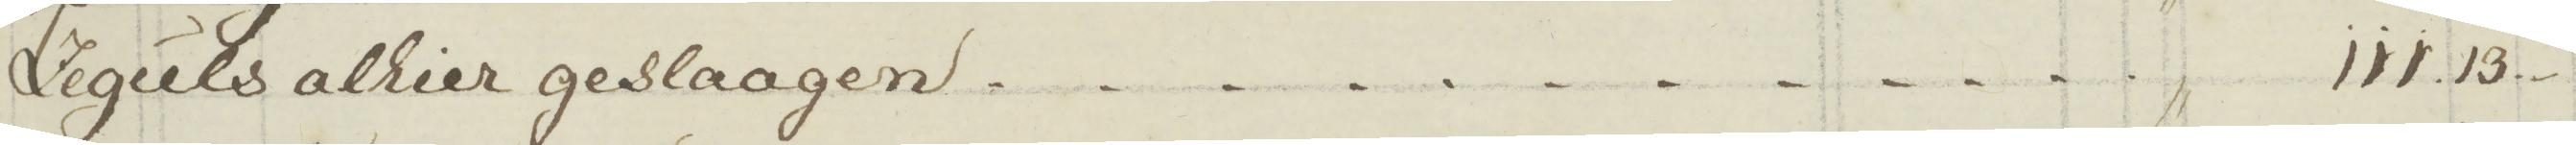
Zeguls alhier geslaagen - - - - - - - - - - - „111.13.—
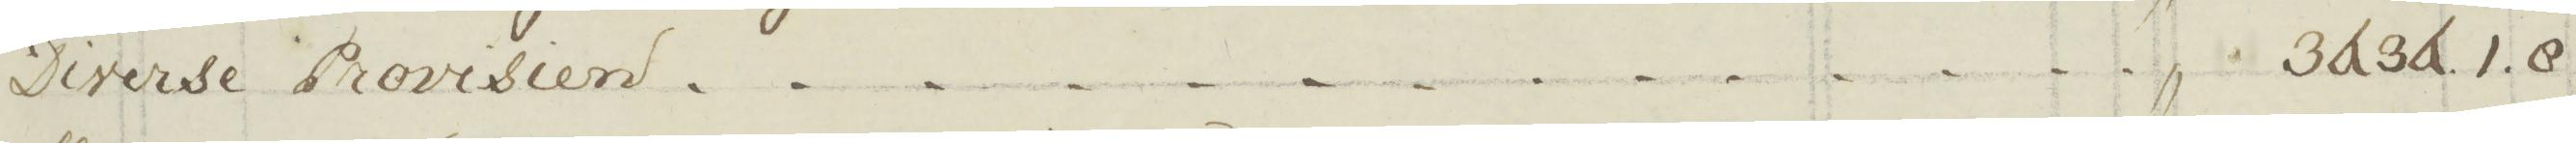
Diverse Provisien - - - - - - - - - - - - - „3434. 1.8
